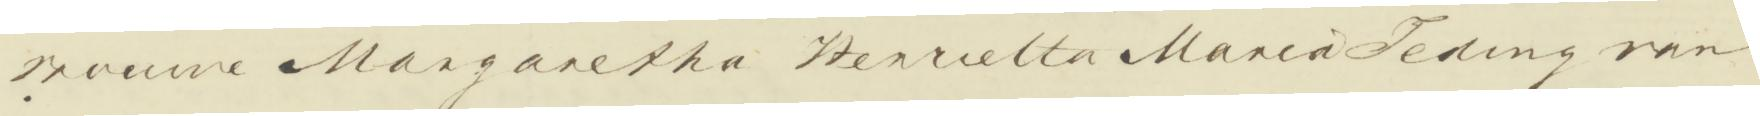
vrouwe Margaretha Henrietta Maria Teding van
